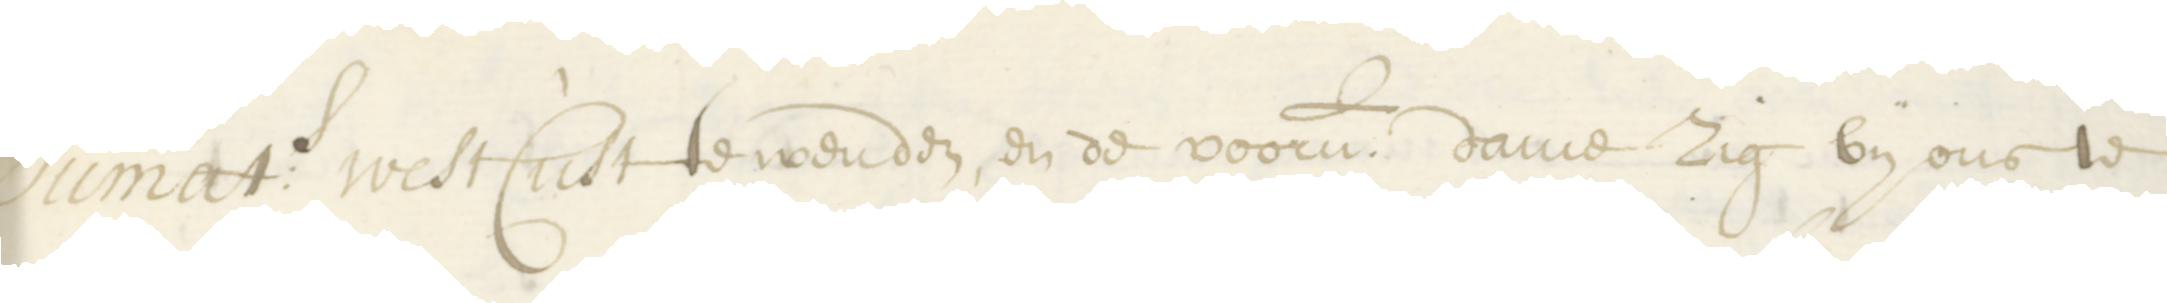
Sumat:s west Cust te wenden, en de voorn: dame zig bij ons te
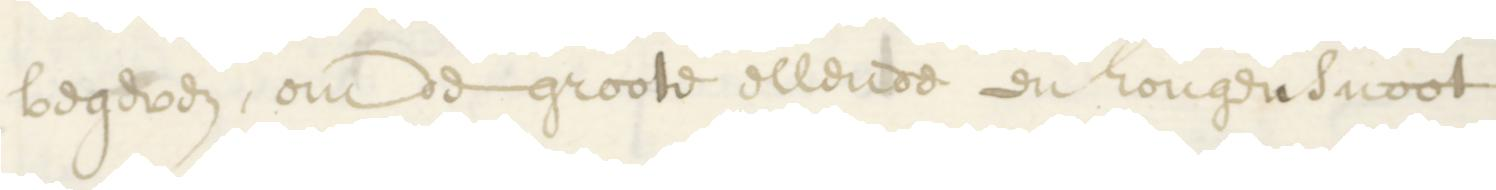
begeven, om de groote ellende en hongenswoot
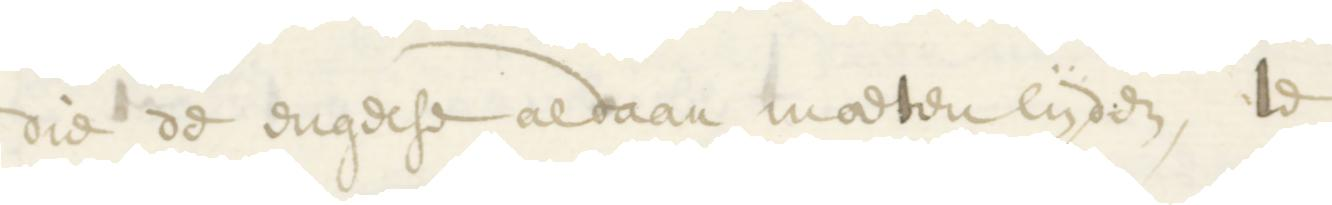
die de engelse aldaar moetenlijden, te
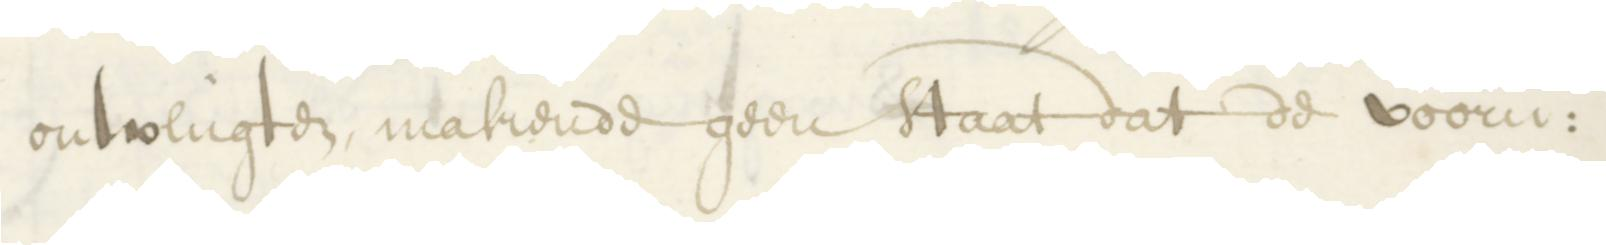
ontvlugten, makende geen staat dat de voorn:
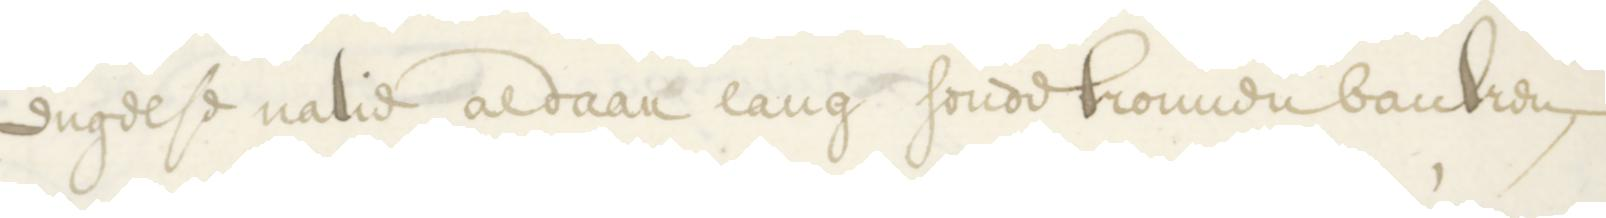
Engelse natie aldaar lang soude konnen banken,
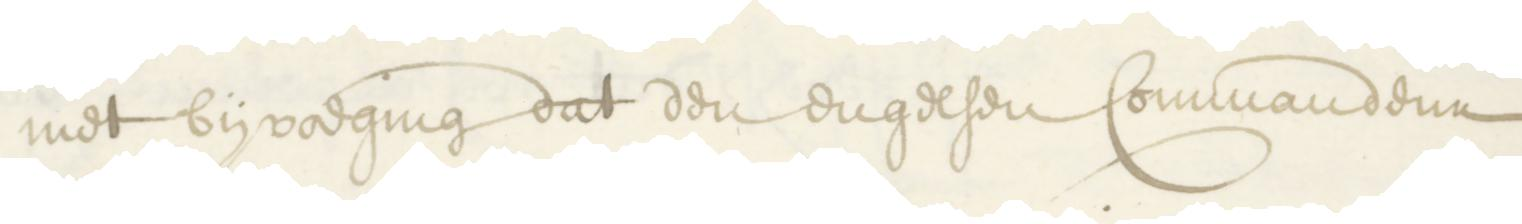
met bijvoeging dat den engelsen Commandeur
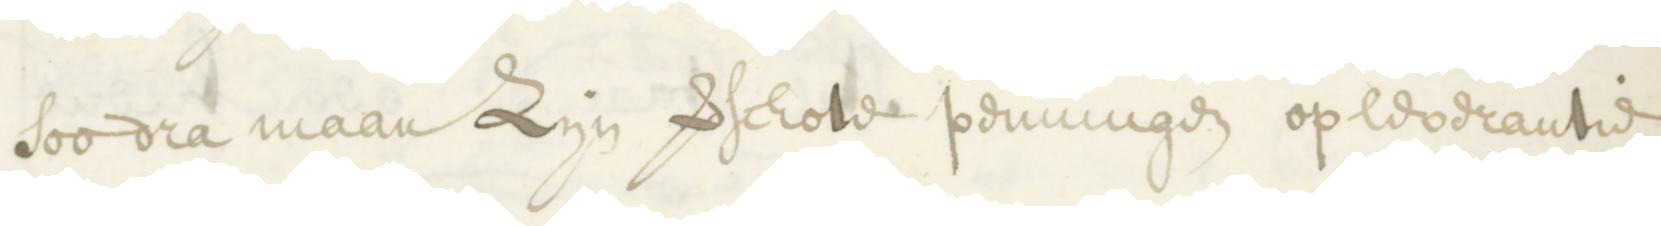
soo dra maan zijn verschote pennnigen opleverantie
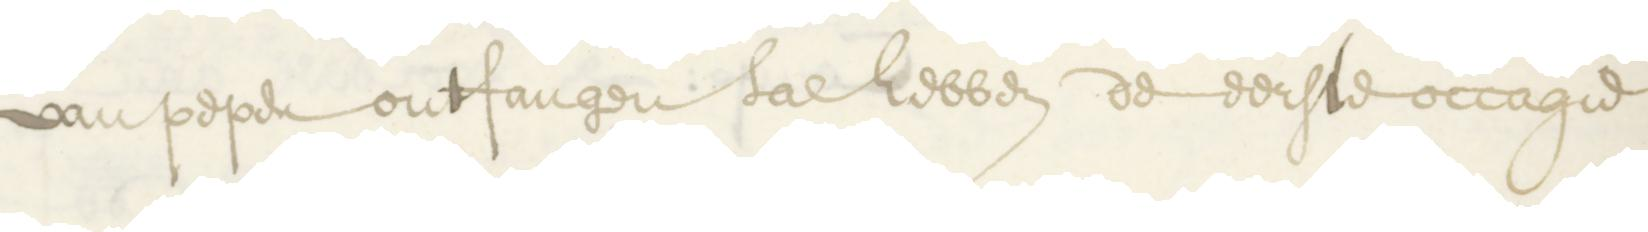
van peper ontfangen sal hebben de eerste occagie
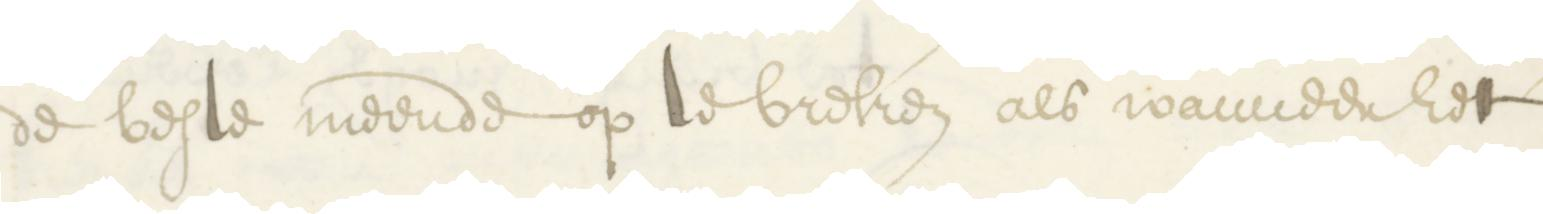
de beste meende op te breken als wanneer het
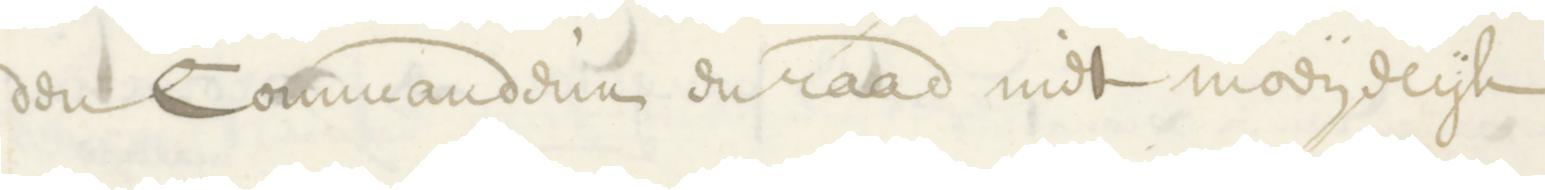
den Commandeur en raad niet moeijelijk
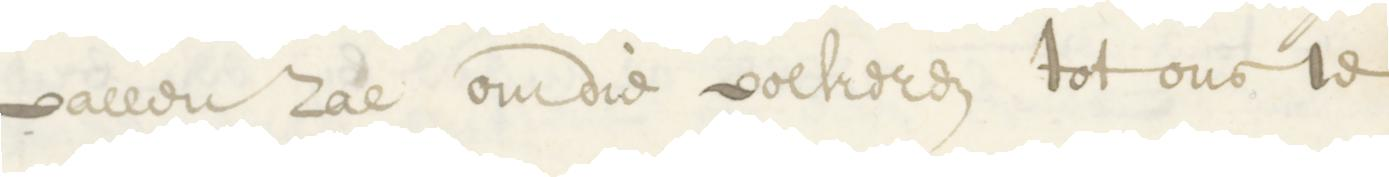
vallen zal om die volkeren tot ons te
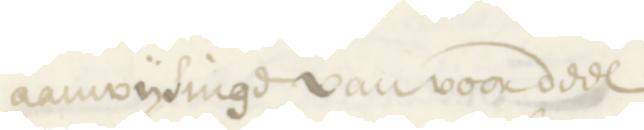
aanwijsinge van voor deel
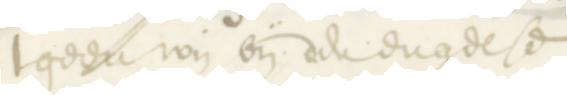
tgeen wij bij den engelse
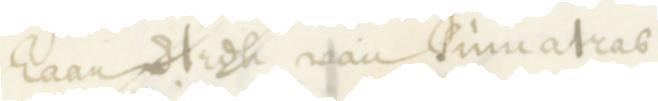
haar vertrek van Sumatras
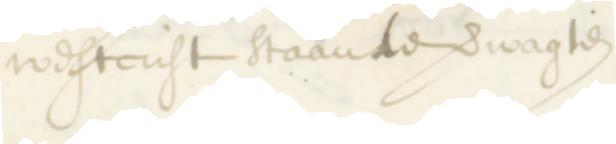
westcust staande verwagten
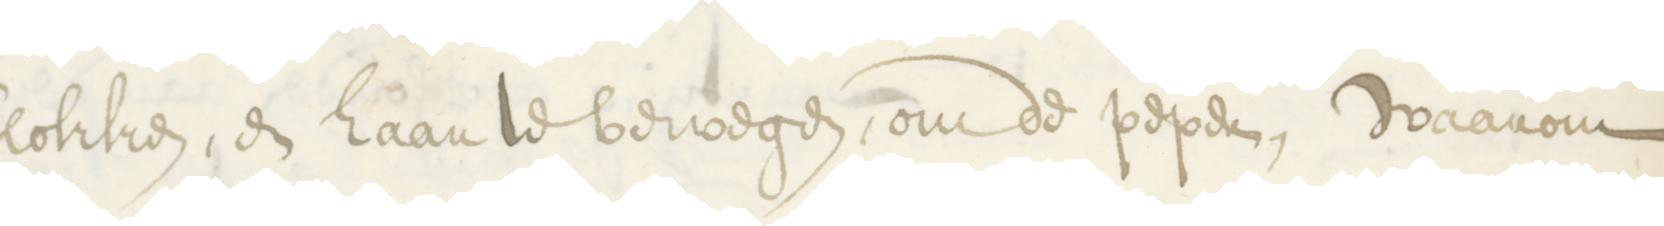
lokken, en haan te bewegen, om de peper, waarom
